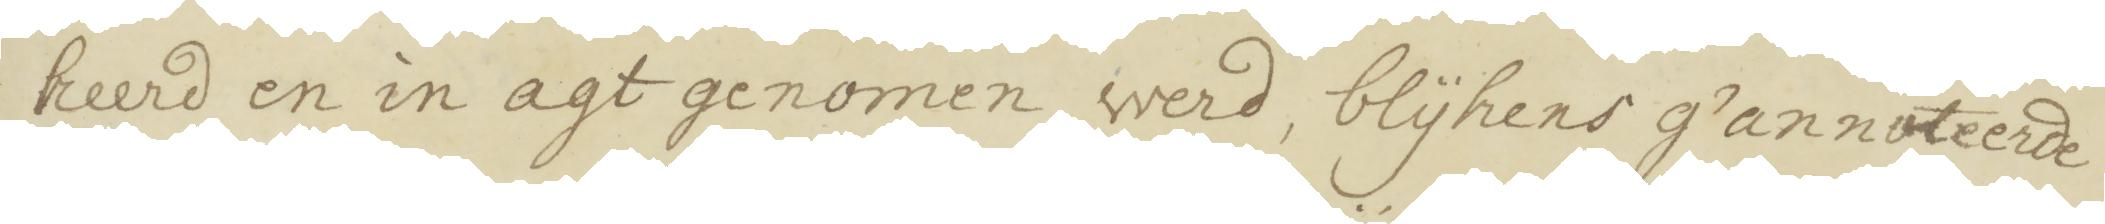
keerd en in agt genomen werd, blijkers g’annoteerde
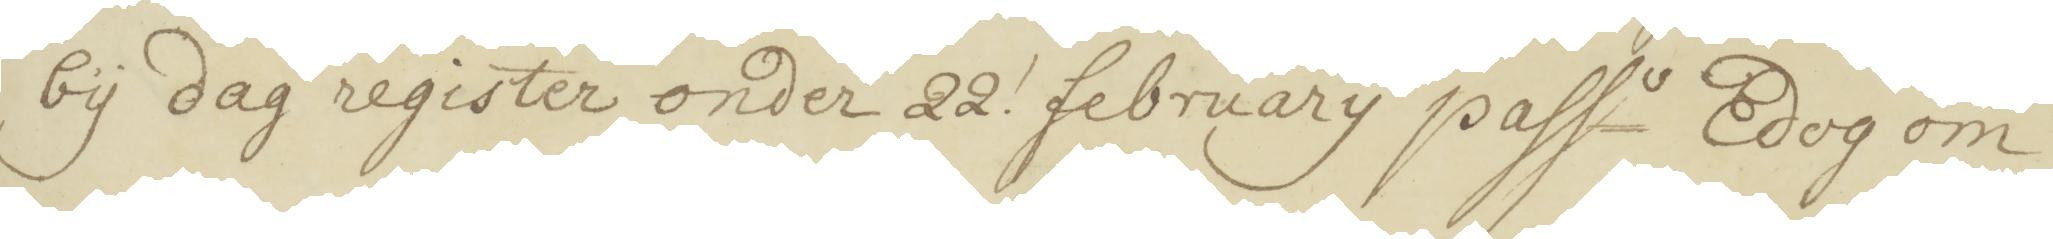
bij dag register onder 22.' februarij pass=o Edog om
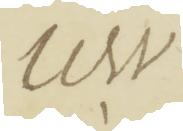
UW
